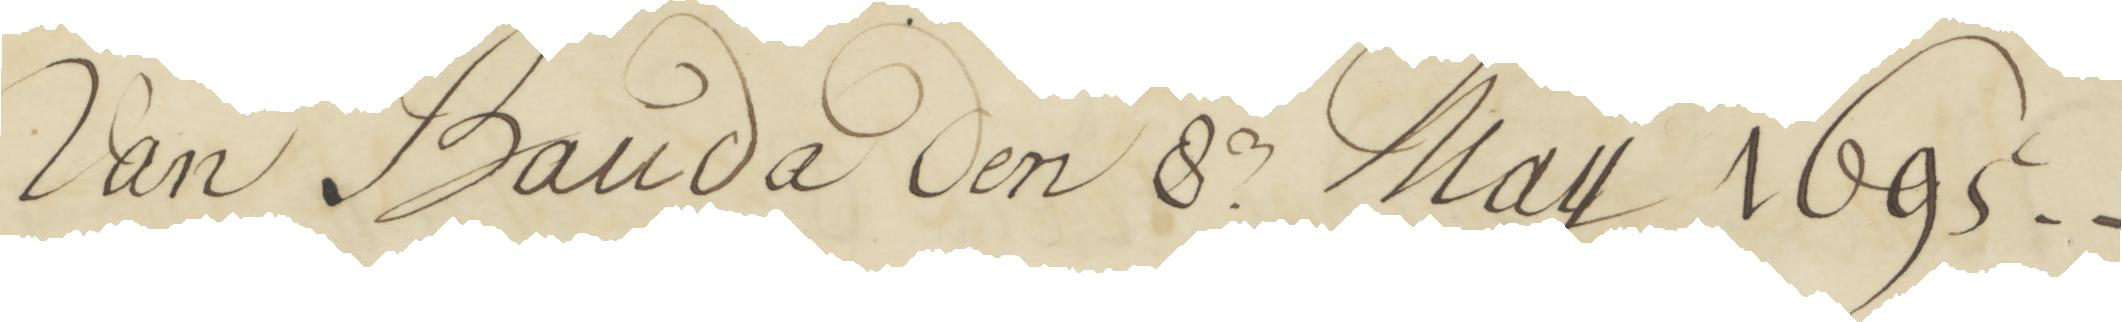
Van Banda den 8.n Maij 1695.
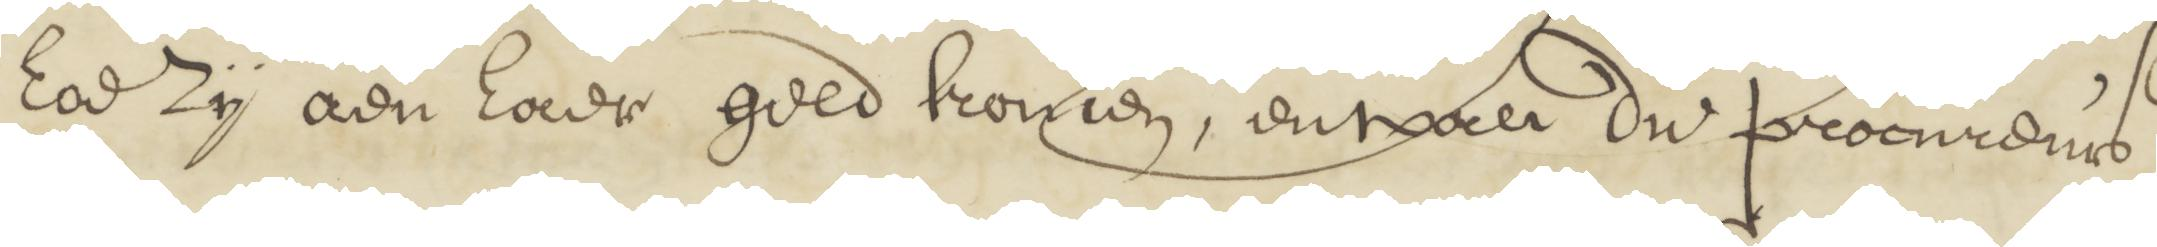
hoe zij aen haer geld komen, en waer die procureurs
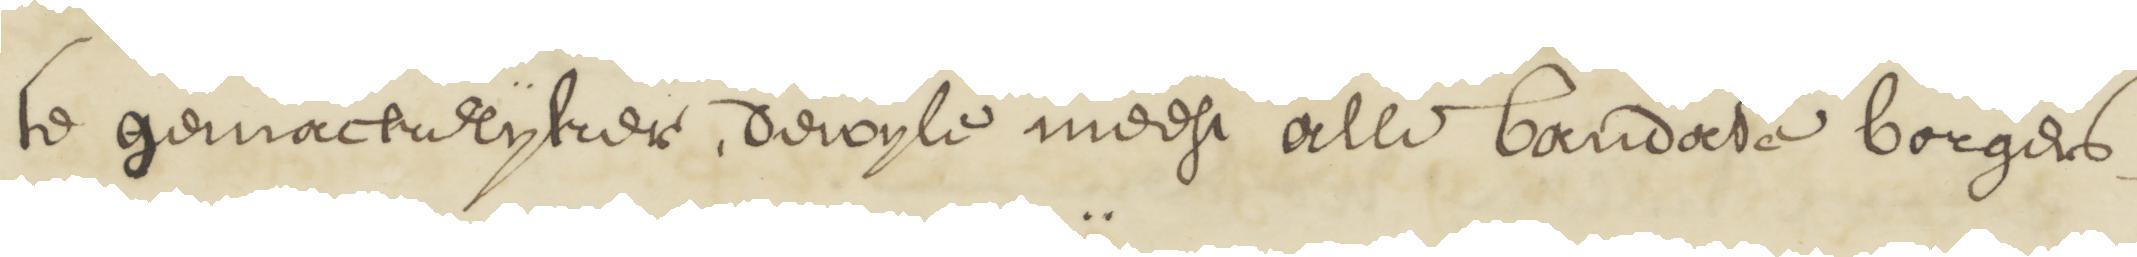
te gemackelijker, dewijle meest alle bandase borgers
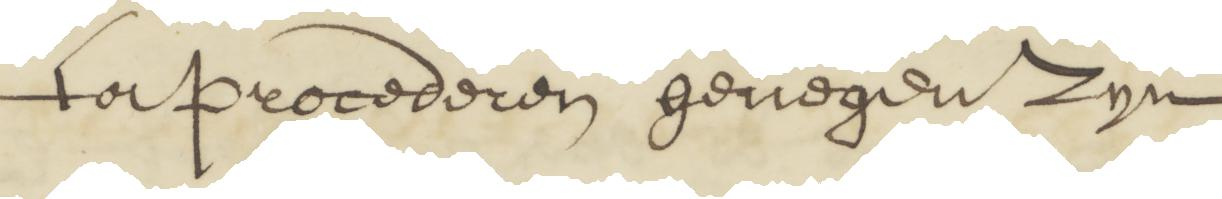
tot procederen genegen zijn
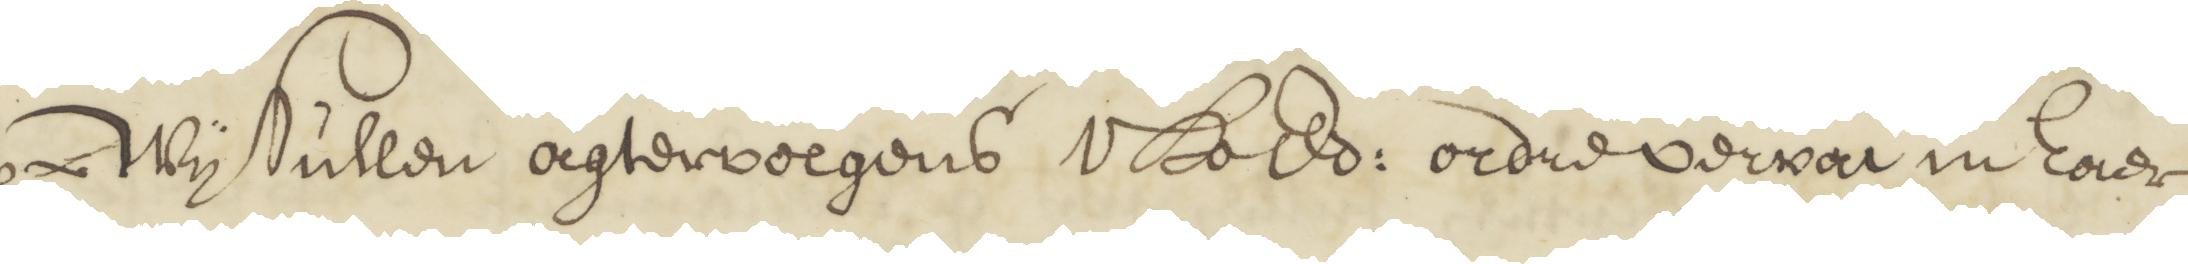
Wij sullen agtervolgens VHoEd: ordre vervat in haer
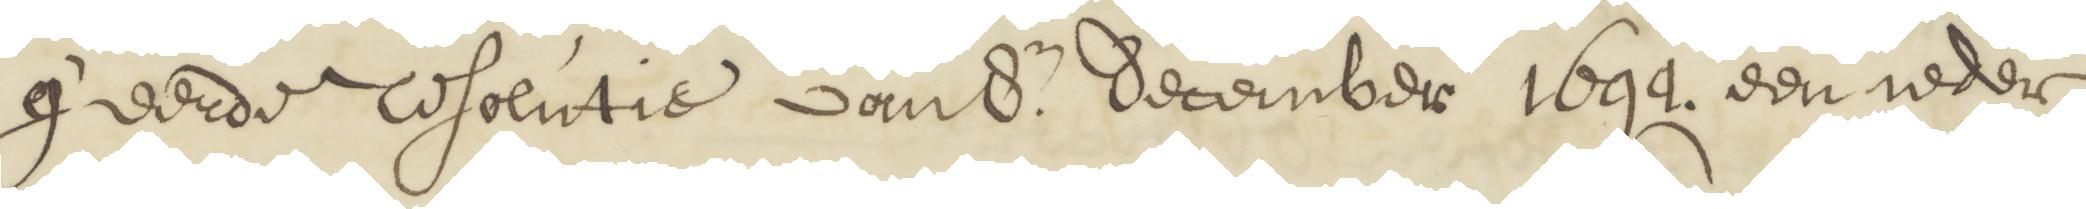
g’eerde resolutie van 8.n december 1694. een ieder
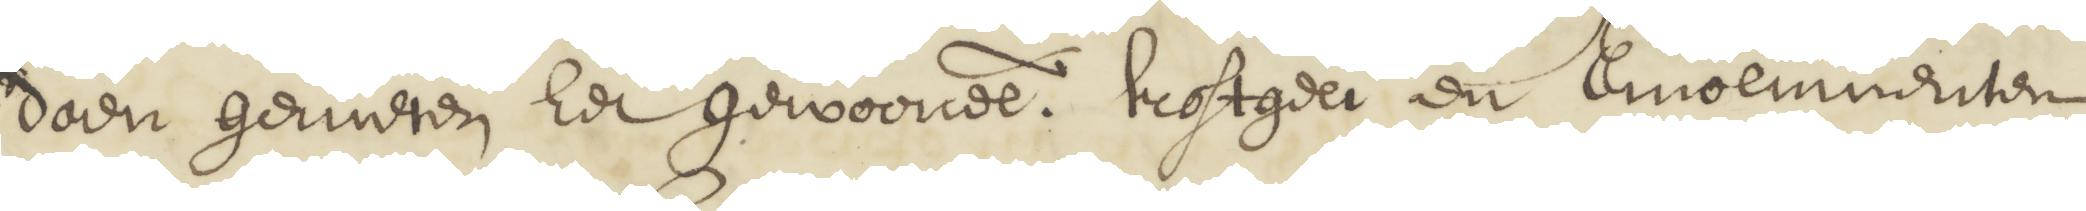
doen genieten het gewoonelijk kostgelt en Emolumenten,
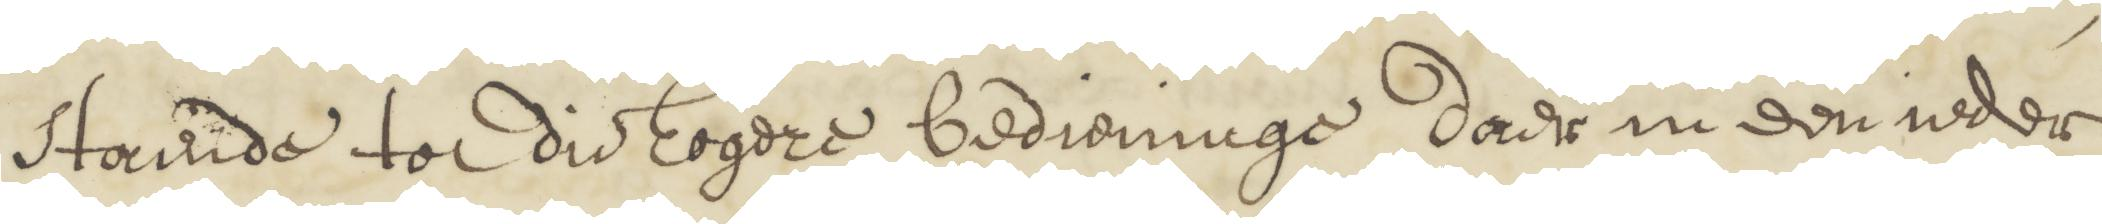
staende tot die hogere bedieninge daer in een ieder
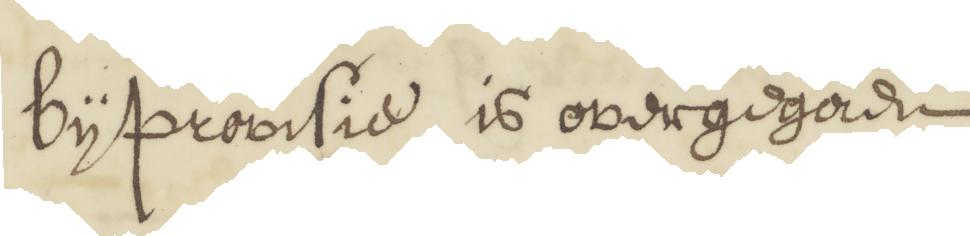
bij provisie is overgegaen
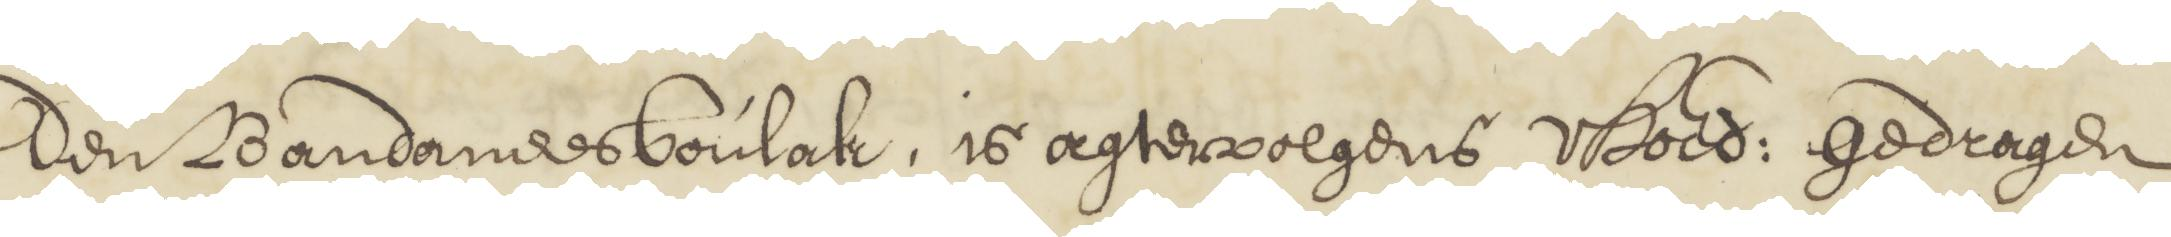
den Bandanees boulak, is agtervolgens VHoEd: gedragen
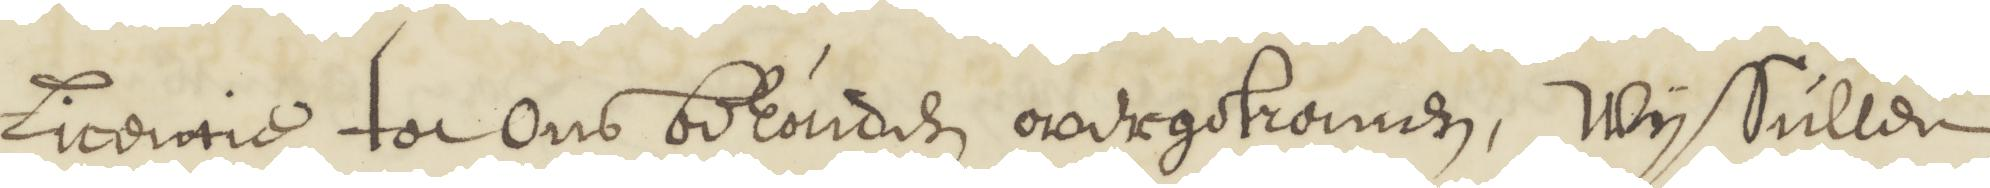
licentie tot ons behouden overgekomen, wij sullen
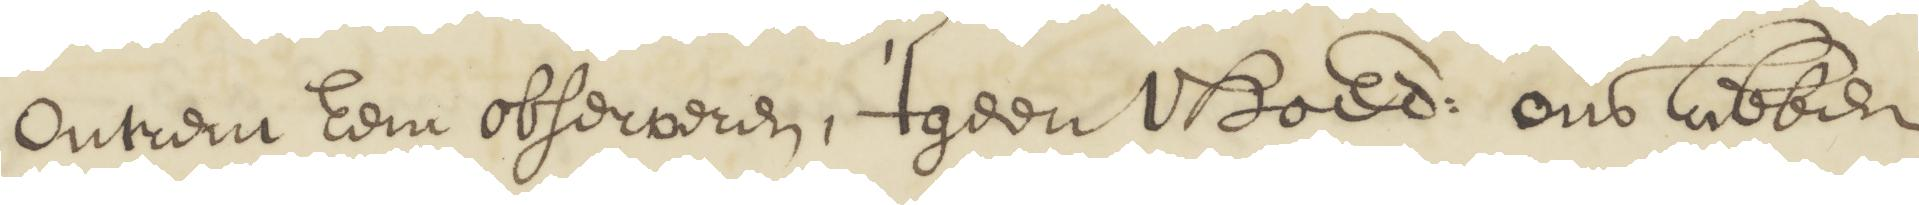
Ontrent hem observeren, ’t geen VHoEd: ons hebben
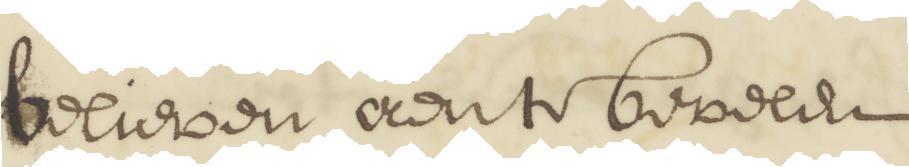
believen aen te bevelen
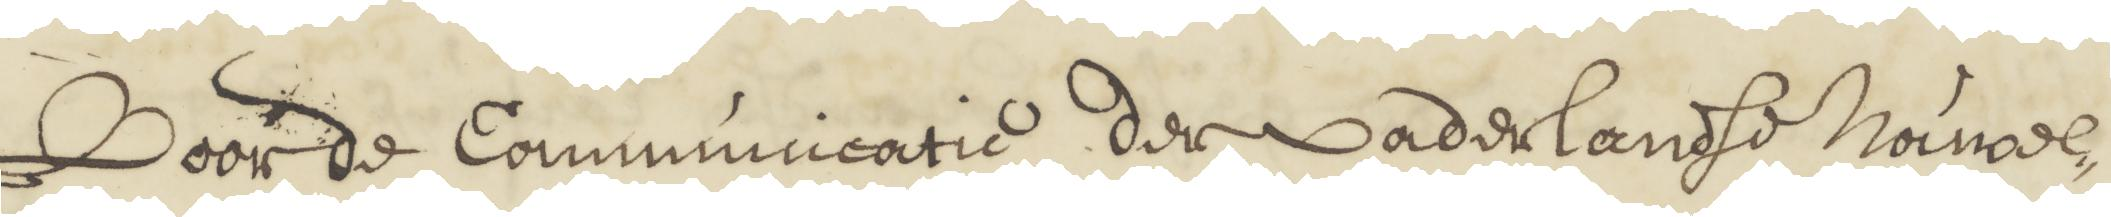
Voor de Communicatie der vaderlandse nouwel„
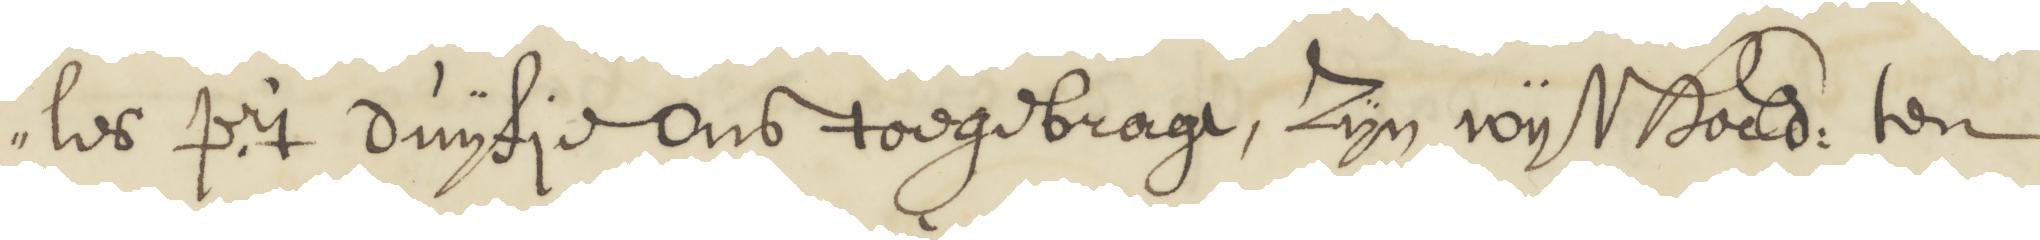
„les p,r't duijfje ons toegebragt, zijn wij VHoEd: ten
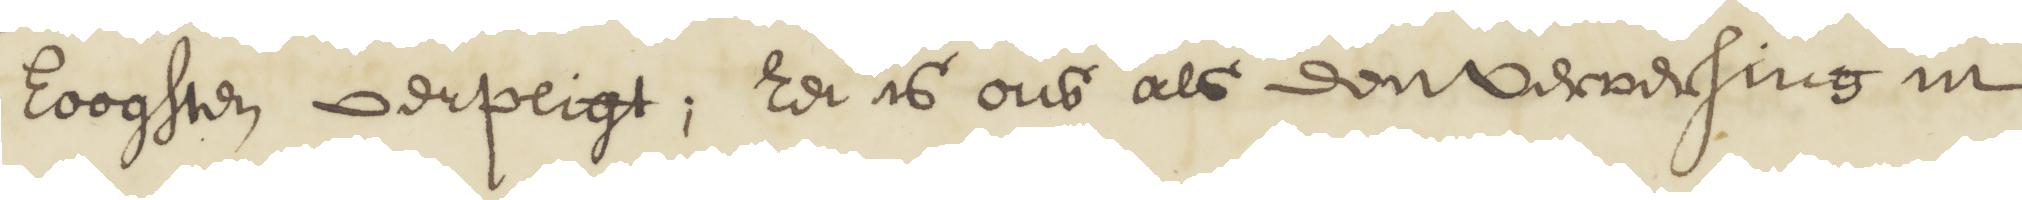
hoogsten verpligt; het is ons als een verversing in
